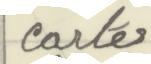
cartes
